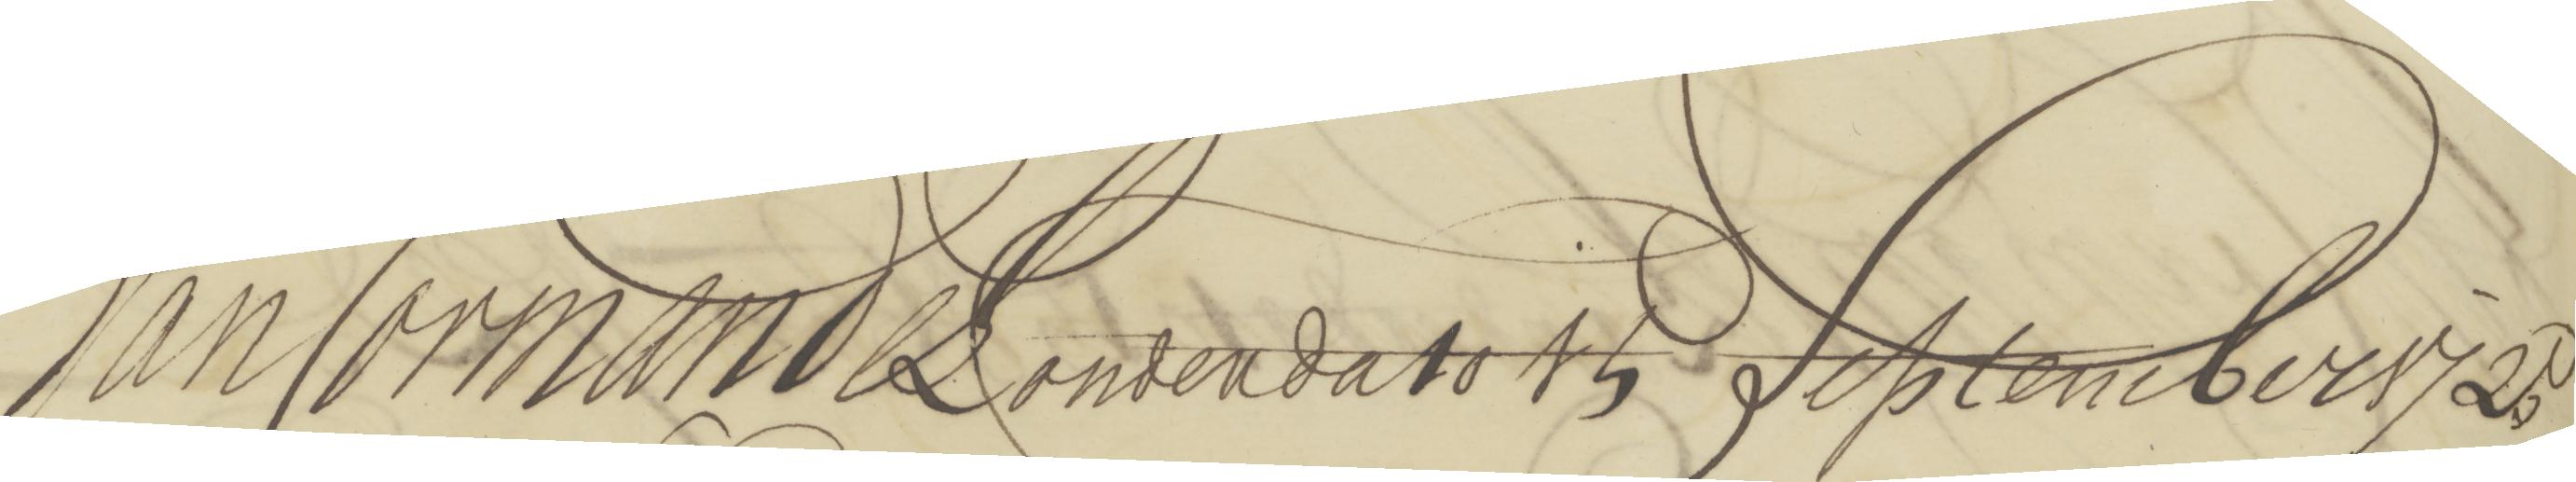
Van Cormandel onder dato 15 September 1725
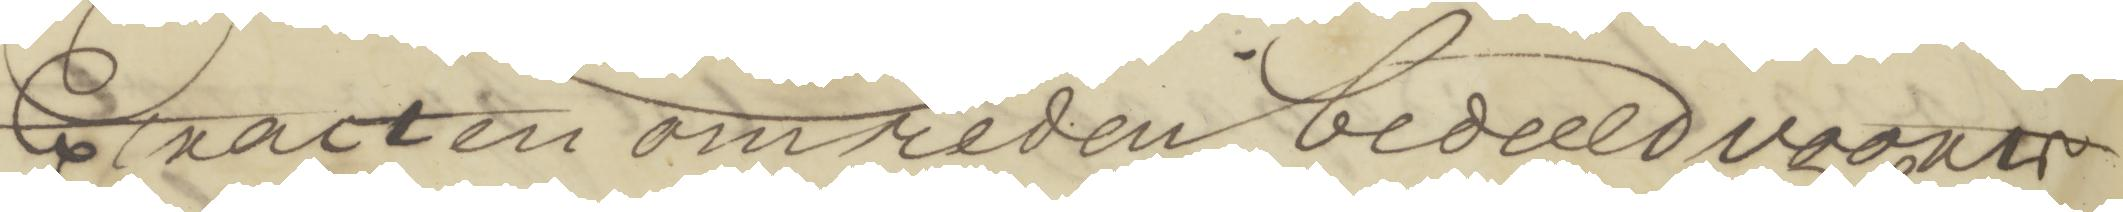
Extracten om reden bedeeld voorts
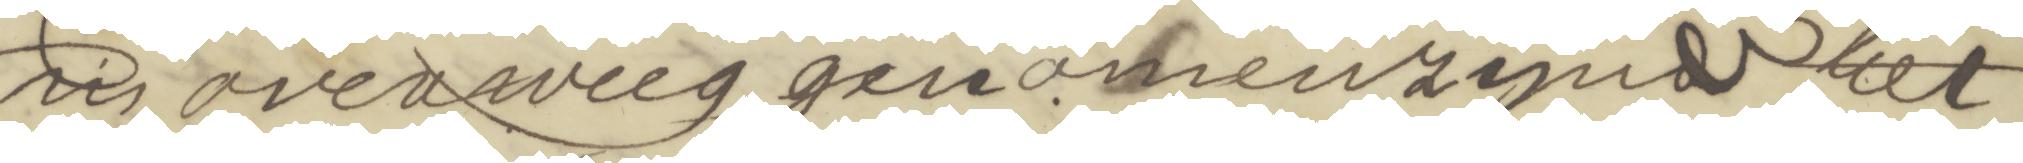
in overweeg genomen zijnde het
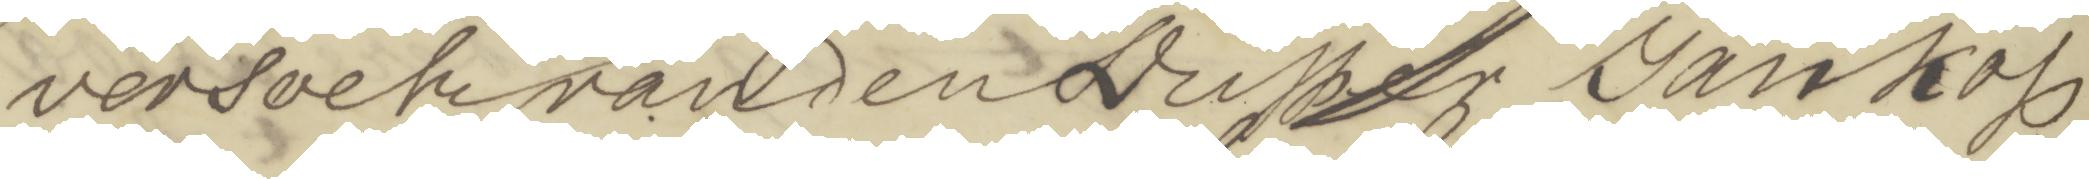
versoek van den schipper Ian kop
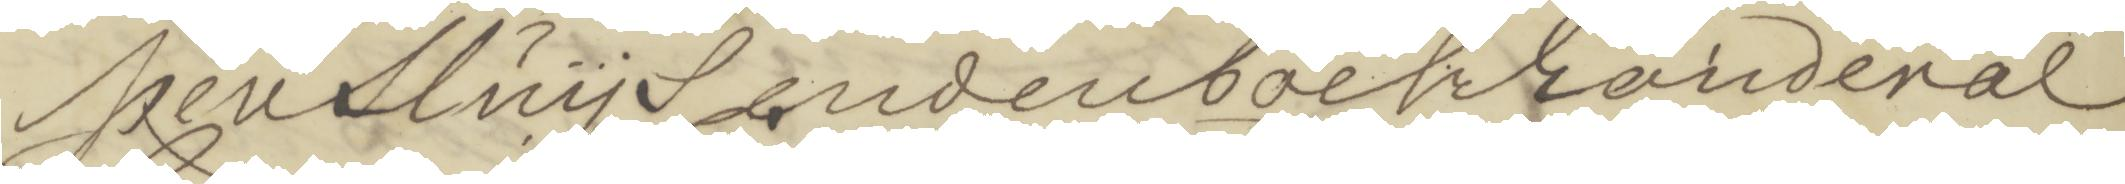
pensluijs enden boekhouder al
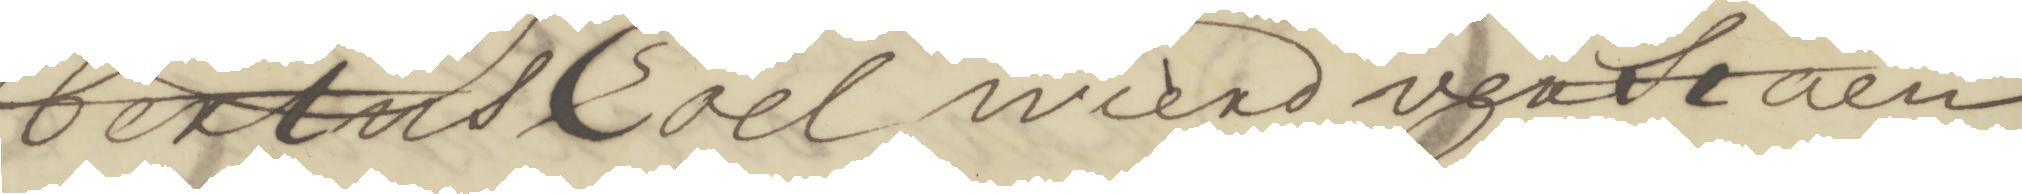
bertus Coel wierd verstaen
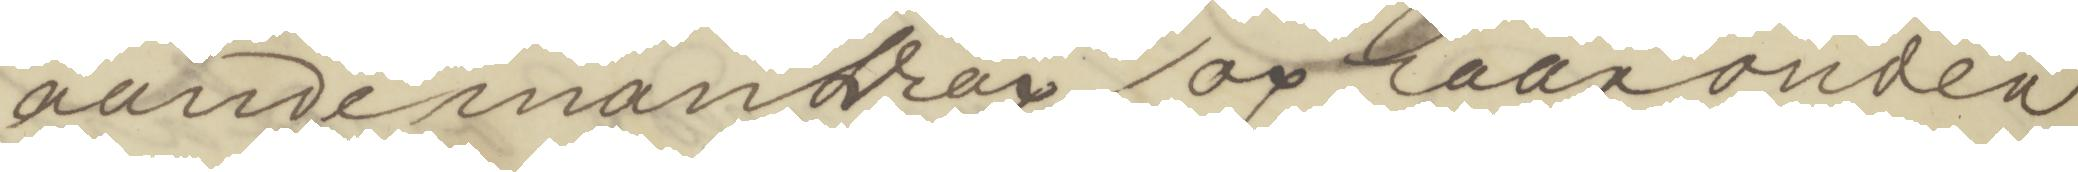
aande manschap op haar onder
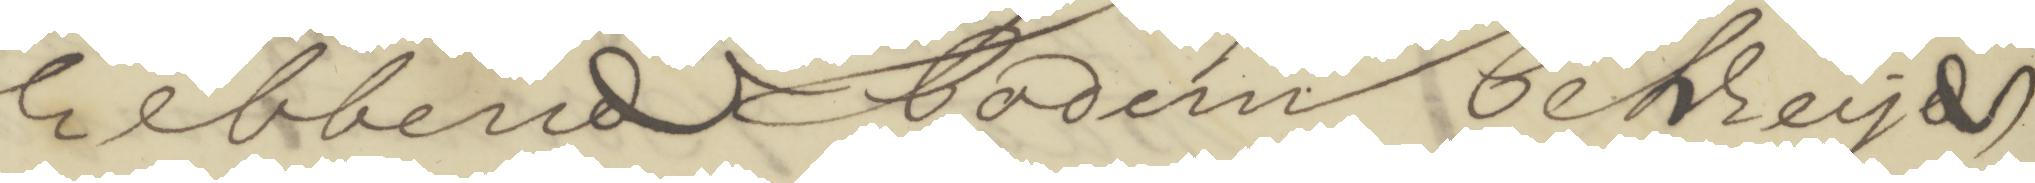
hebbende bodem bescheijden
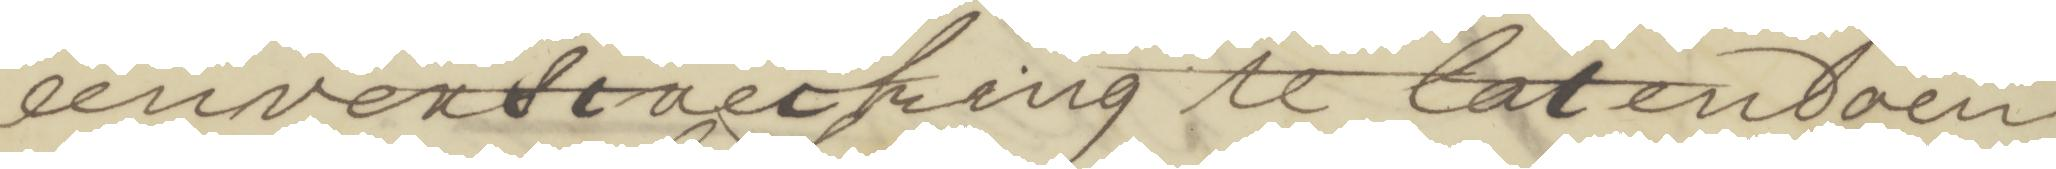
een verstrecking te laten doen
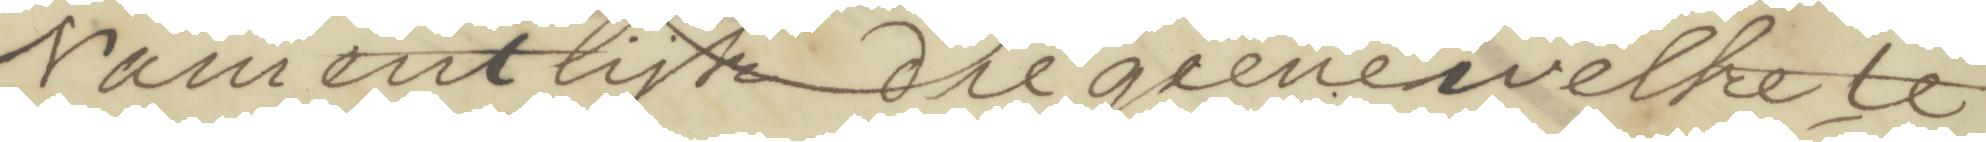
Namentlijk die geene welke te
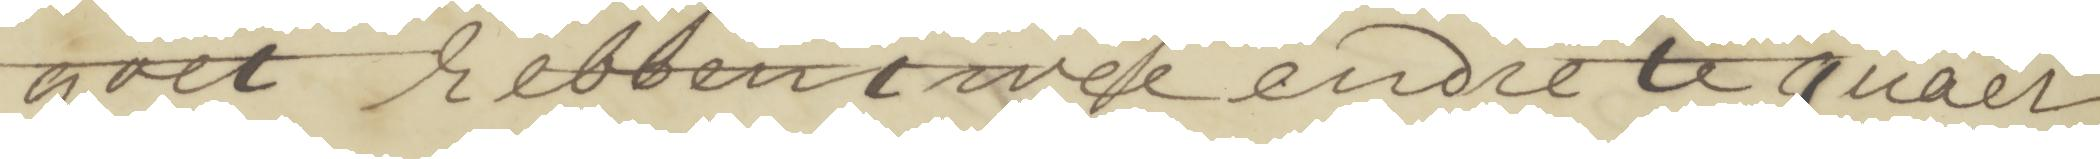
goet hebben twee endie te quaet
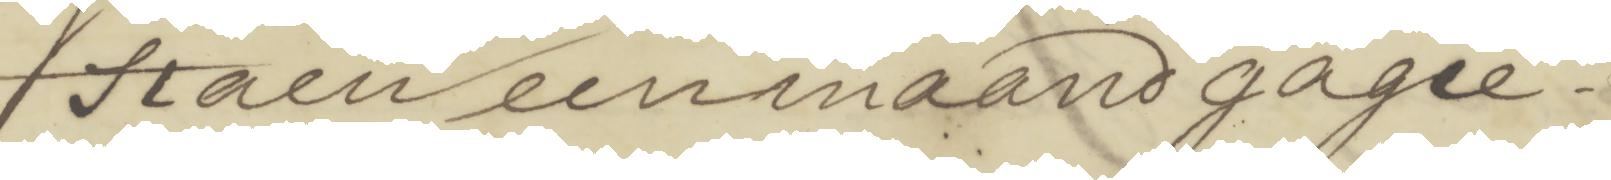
staen een maand gagie.
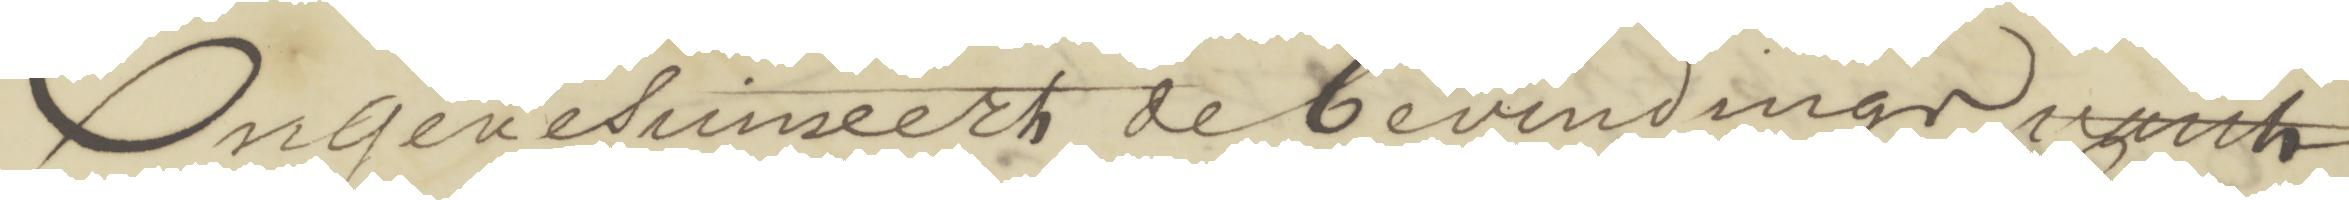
En geresumeert de bevindinge van't
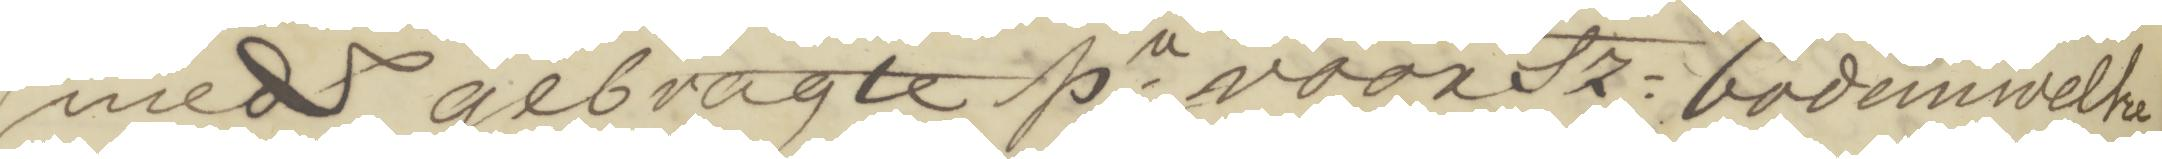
mede gebragte p.r voorsz: bodem welke
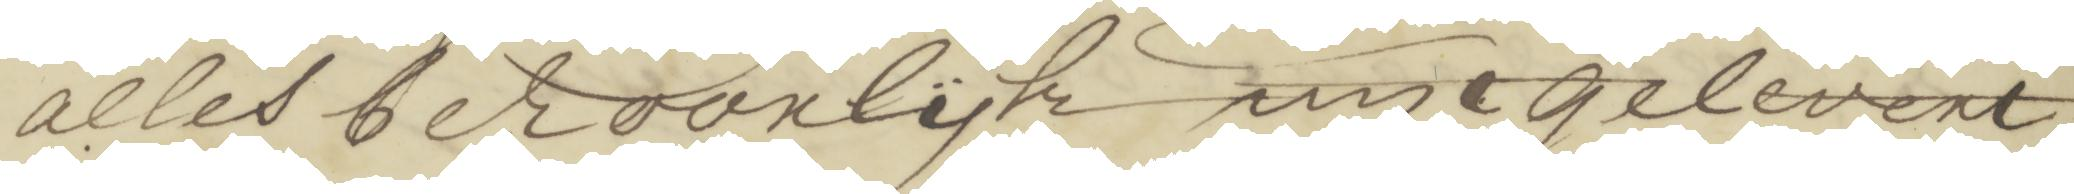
alles behoorlijk uyt gelevert
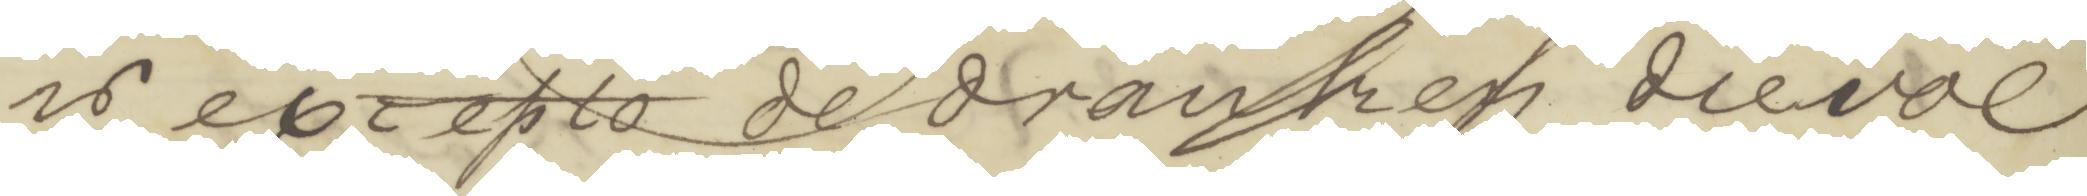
is excepto de dranken die vol
